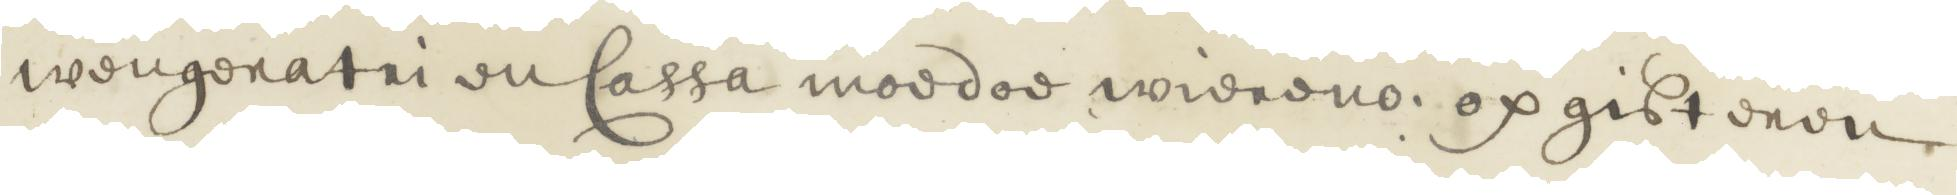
wengeratri en Cassa moedoe wiereno. op gisteren
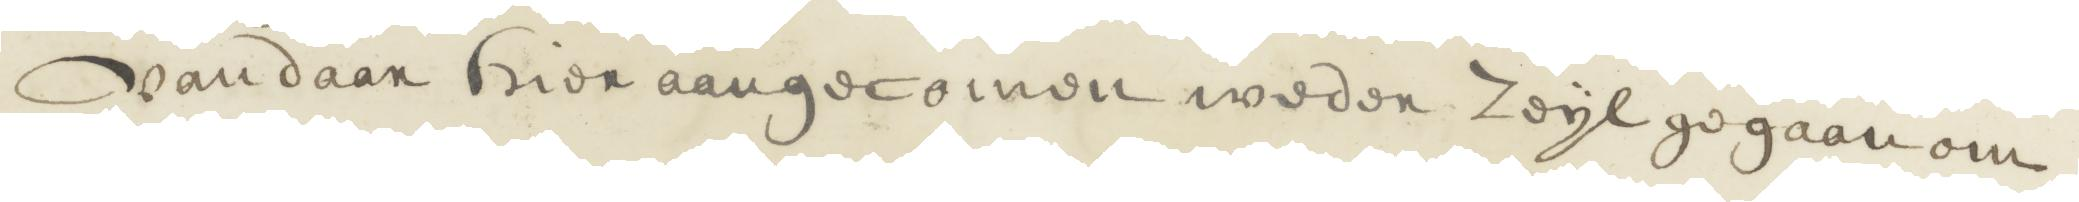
vandaar hier aangecomen weder Zeijl gegaan om
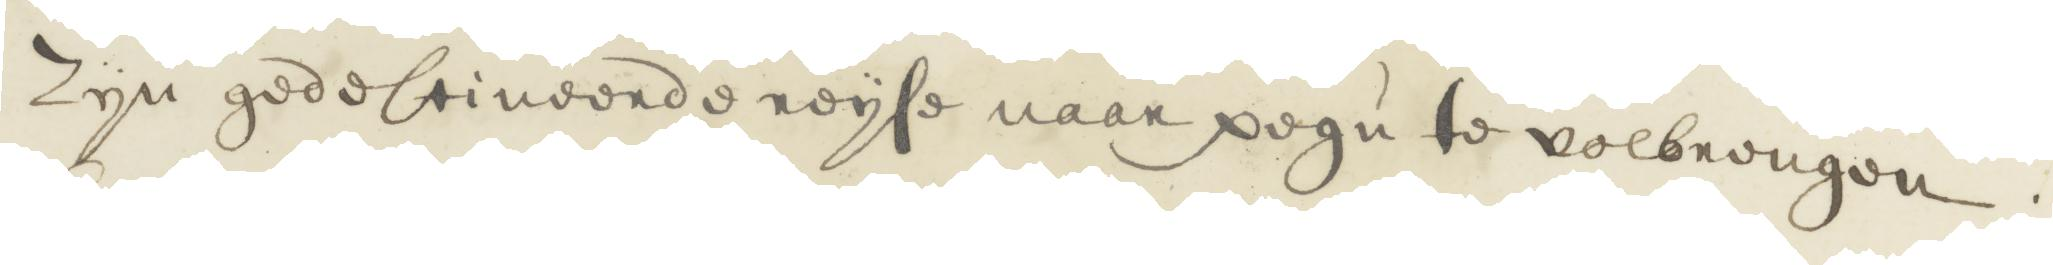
Zijn gedestineerde reijse naar pegu te volbrengen.
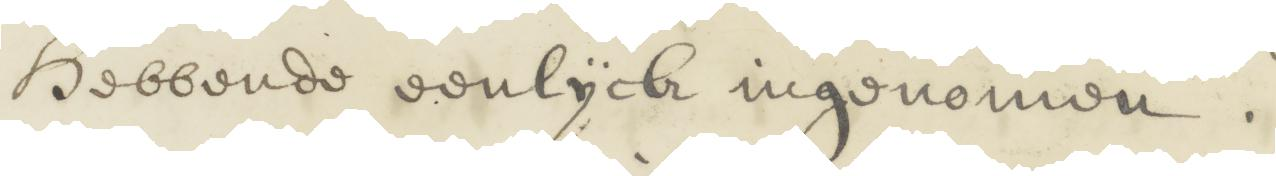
Hebbende eenlijck ingenomen.
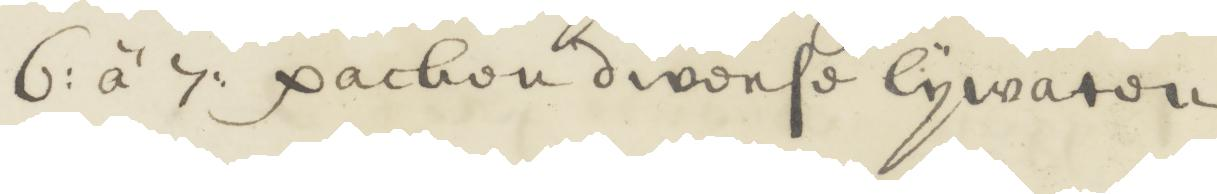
6: â 7: packen diverse lijwaten
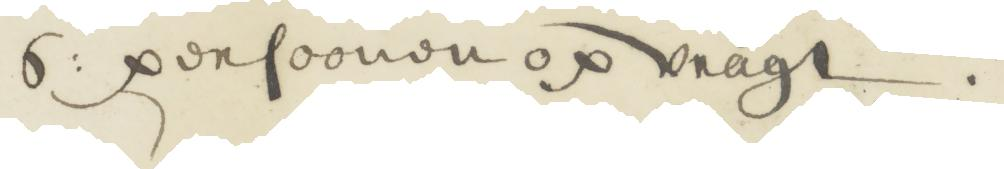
6: persoonen op vragt.
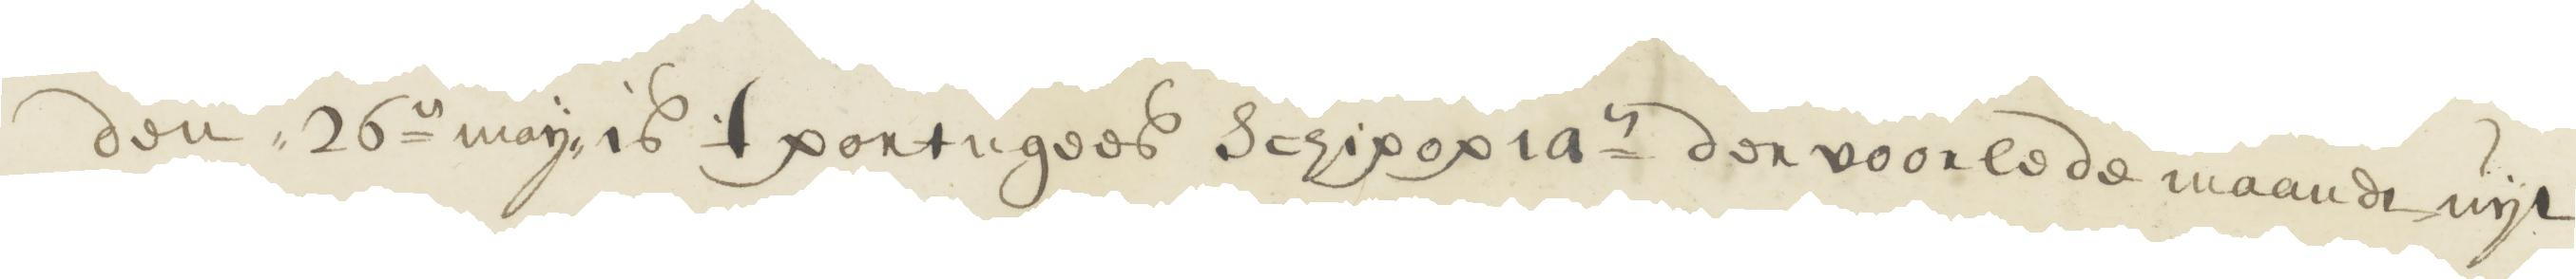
den „ 26=e maij„ is ’t portugees Schip op 14=en der voorlede maandt uijt
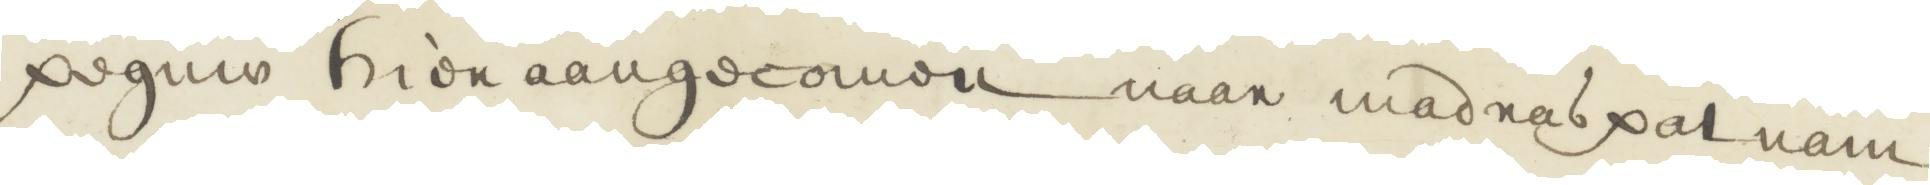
peguw hier aangecomen naar madraspatnam
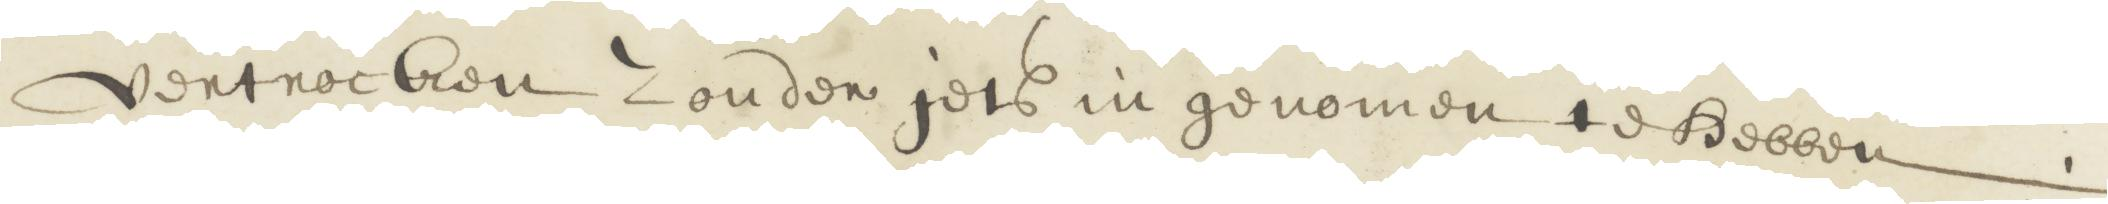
vertrocken Zonder jets in genomen te hebben.
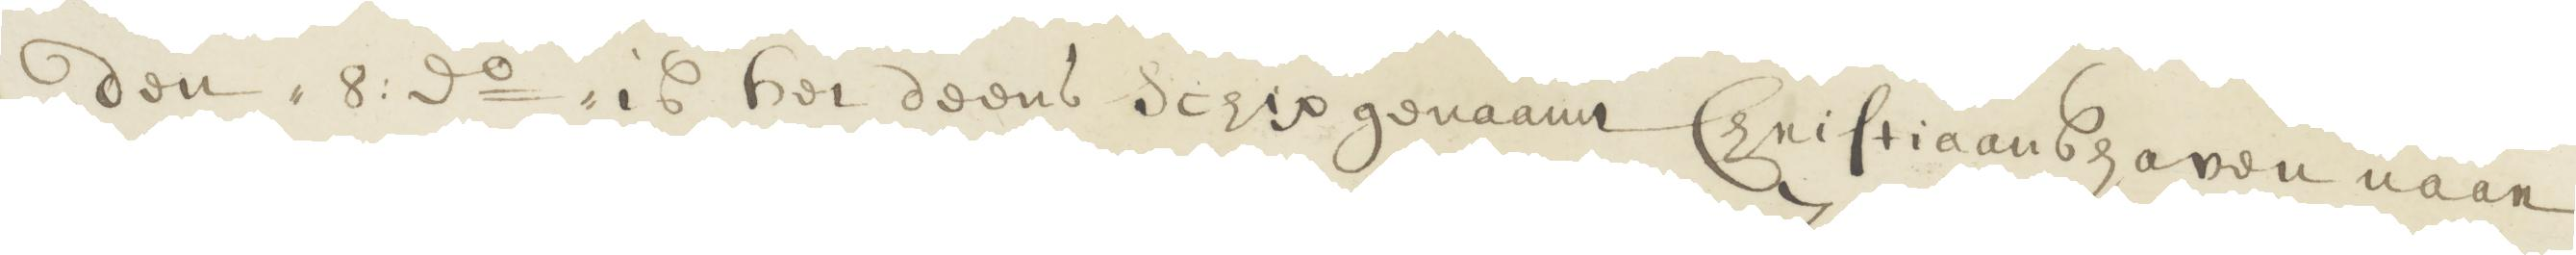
den „ 8: d=o „ is het deens Schip genaamt Christiaanshaven naar
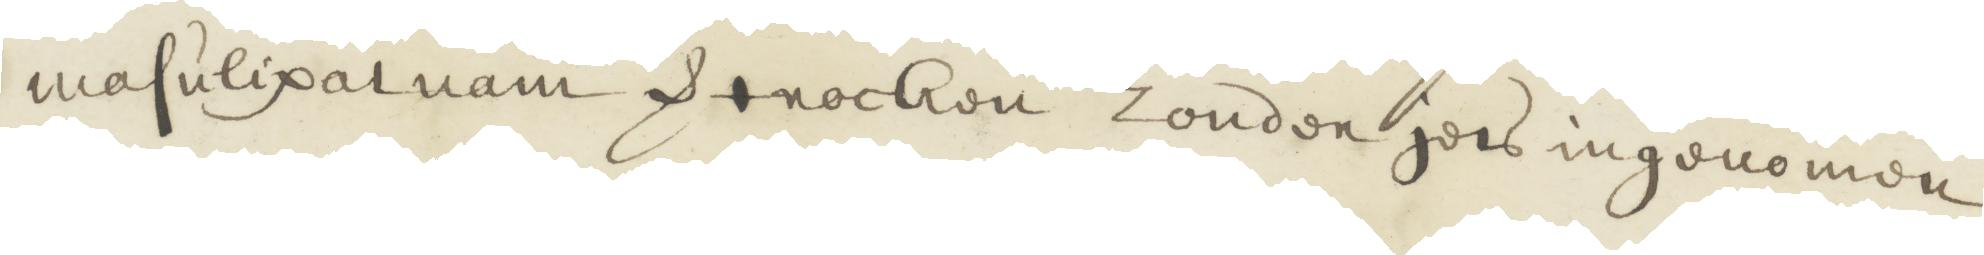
masulipatnam vertrocken Zonder jets ingenomen
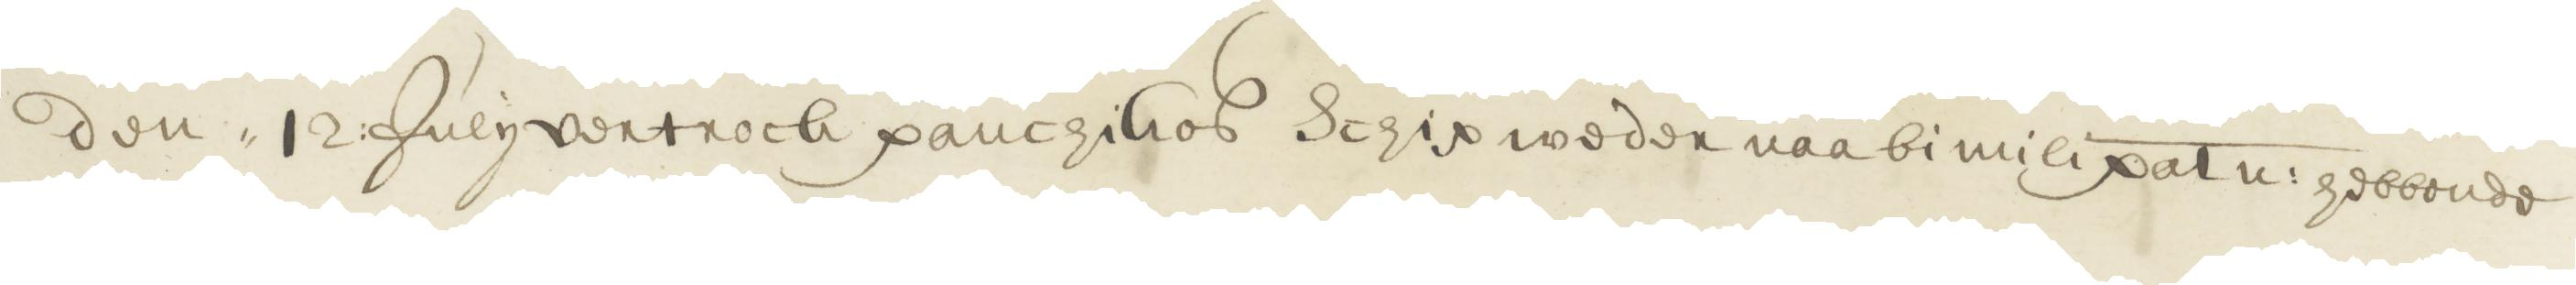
den „ 12: Julij vertrock panchikos Schip weder naa bimilipatn: hebbende
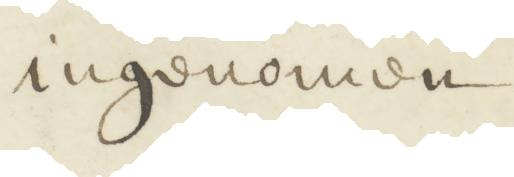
ingenomen
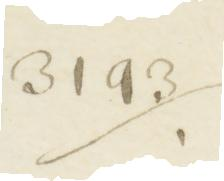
3143
